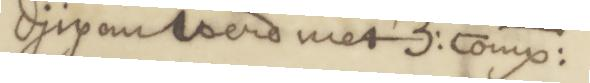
djipan werd met 3: Comp:
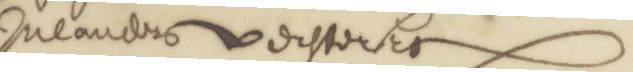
Jnlanders versterkt —
